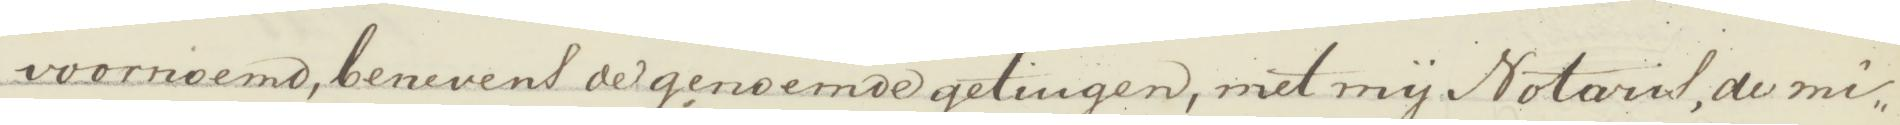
voornoemd, benevens de genoemde getuigen, met mij Notaris, de mi„
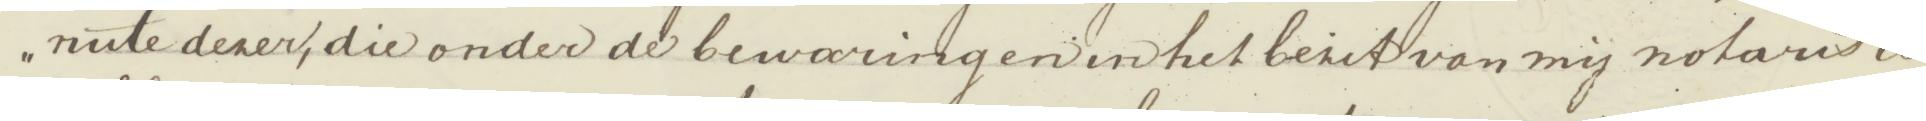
„nute dezer, die onder de bewaringen in het bezit van mij notaris is
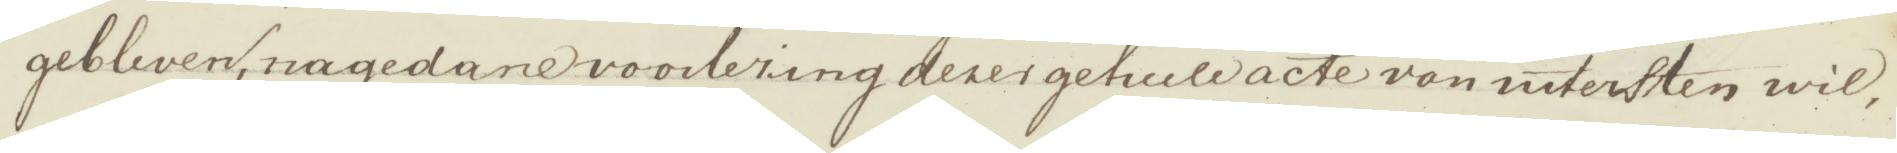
gebleven, na gedane voorlezing dezes geheele acte van uitersten wil,
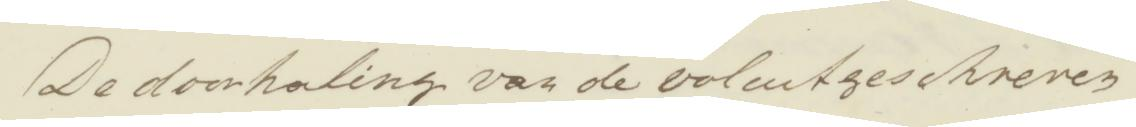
De doorhaling van de voluitgeschreven
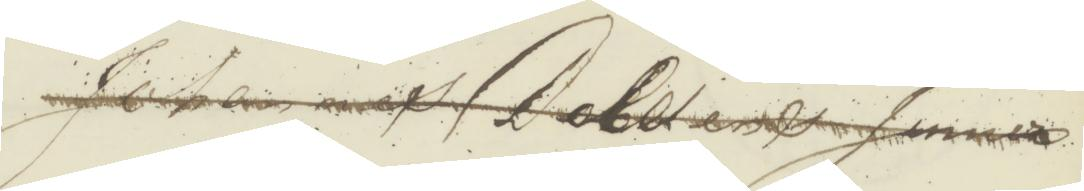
Johan Doedens Junior
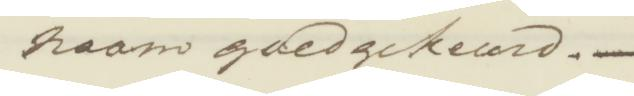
naam goedgekeurd.-
